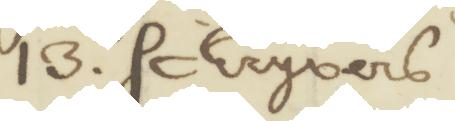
13. schrijvers
